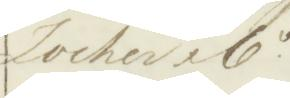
Zocher & C.o
